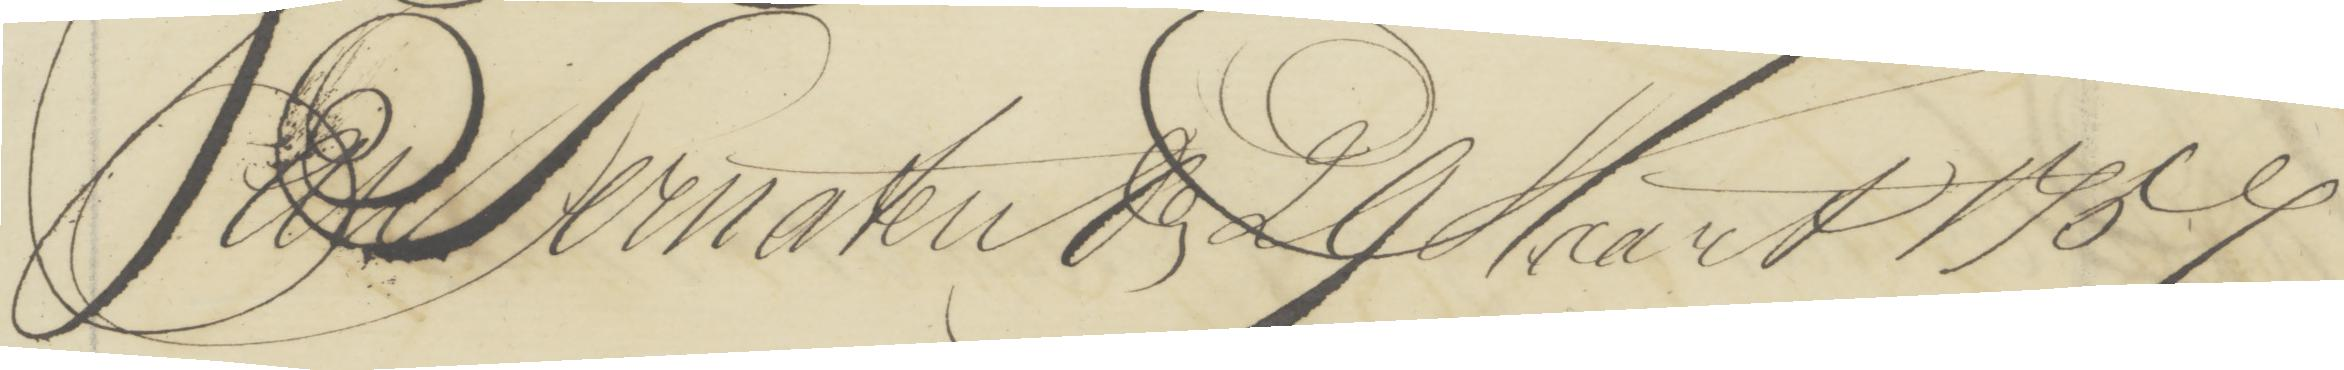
Van Ternaten den 29 Maart 1757
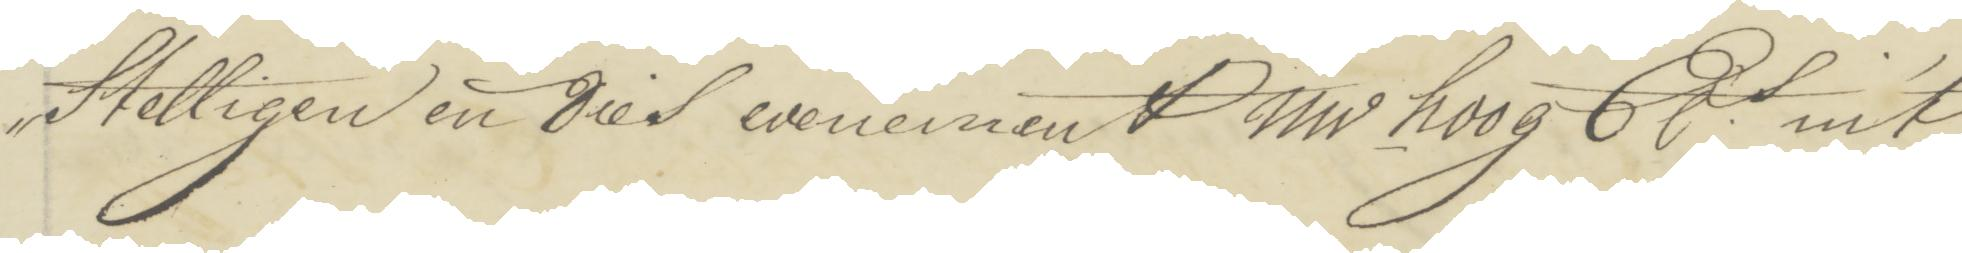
„stelligen en dies evenement uw hoog Ed:s in’t
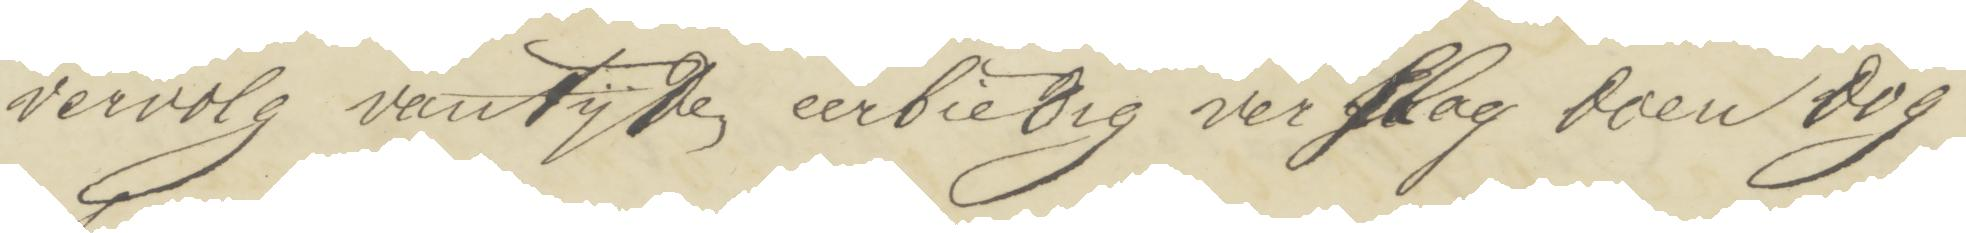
vervolg van tijden eerbiedig verslag doen dog
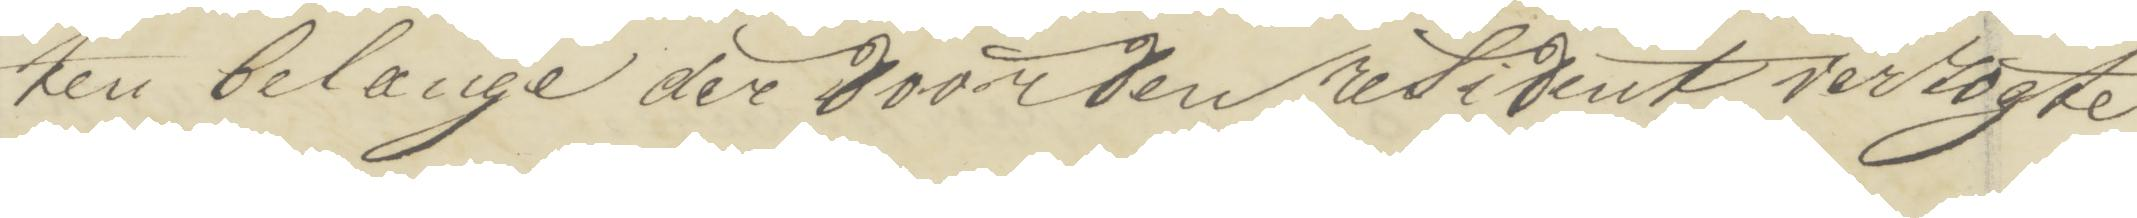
ten belange der door den resident verzogte
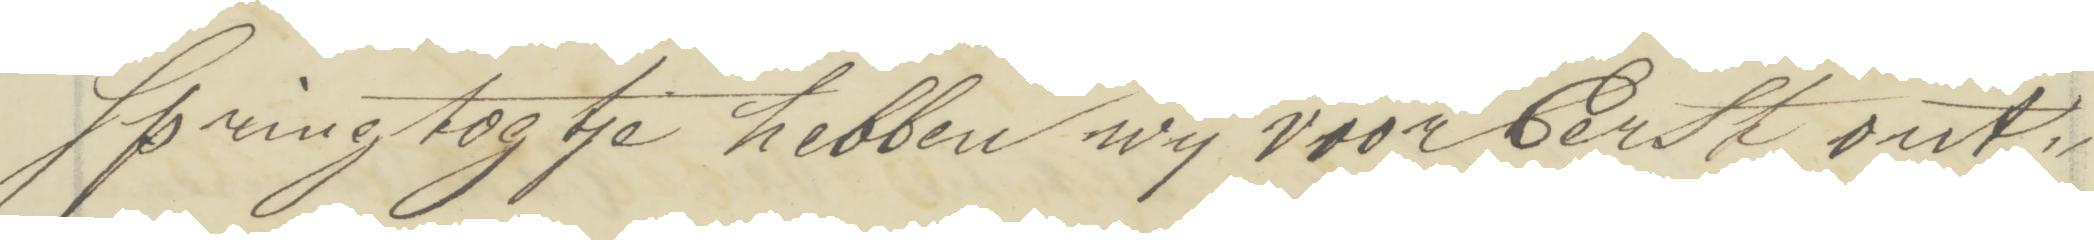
springtogtje hebben wij voor Eerst ont„
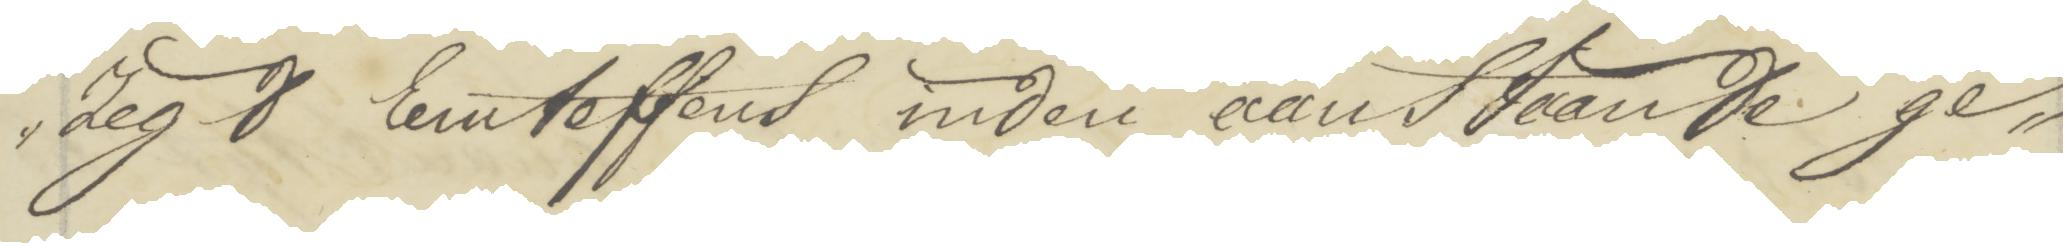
„zegd hem teffens inden aanstaande ge„
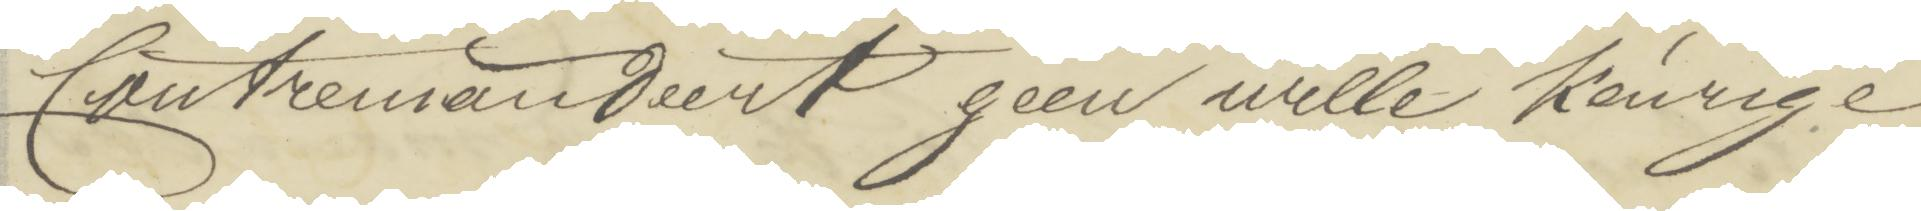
Contremandeert geen wille keurige
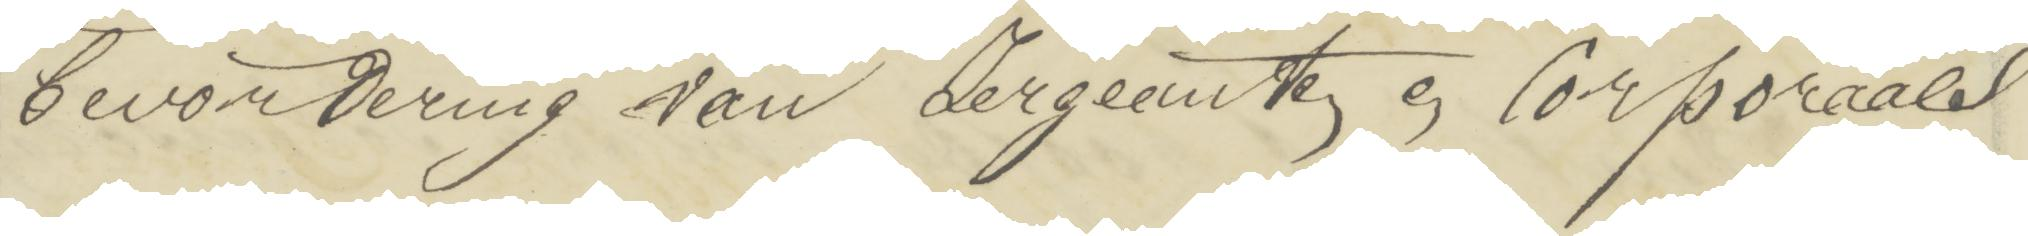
bevordering van zergeanten en Corporaals
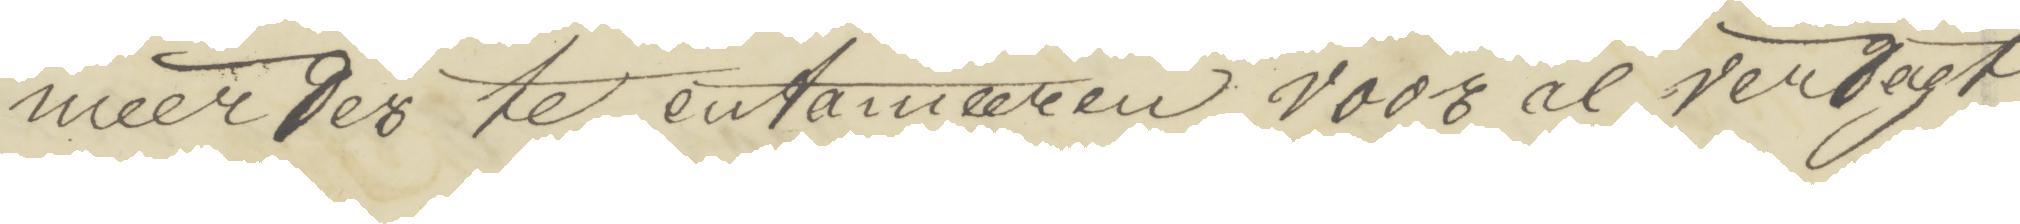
meerder te entameeren voor al verdagt
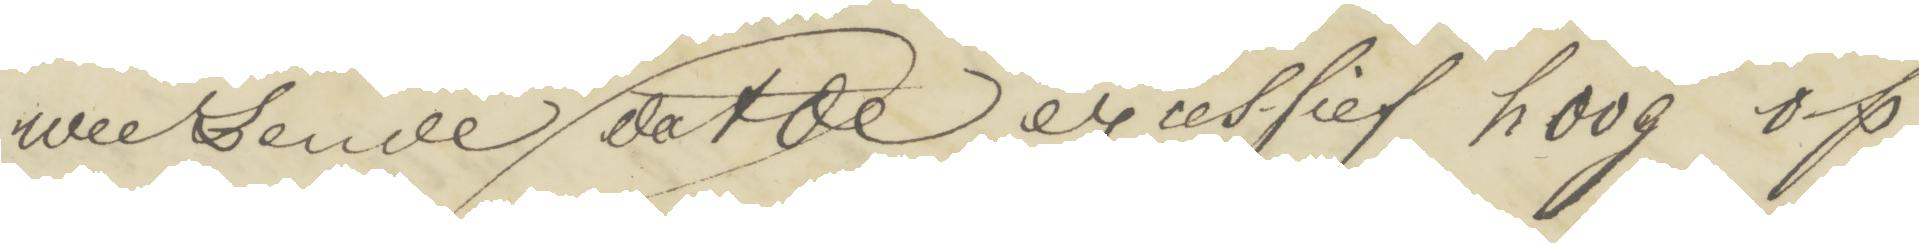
weesende dat de excessief hoog op
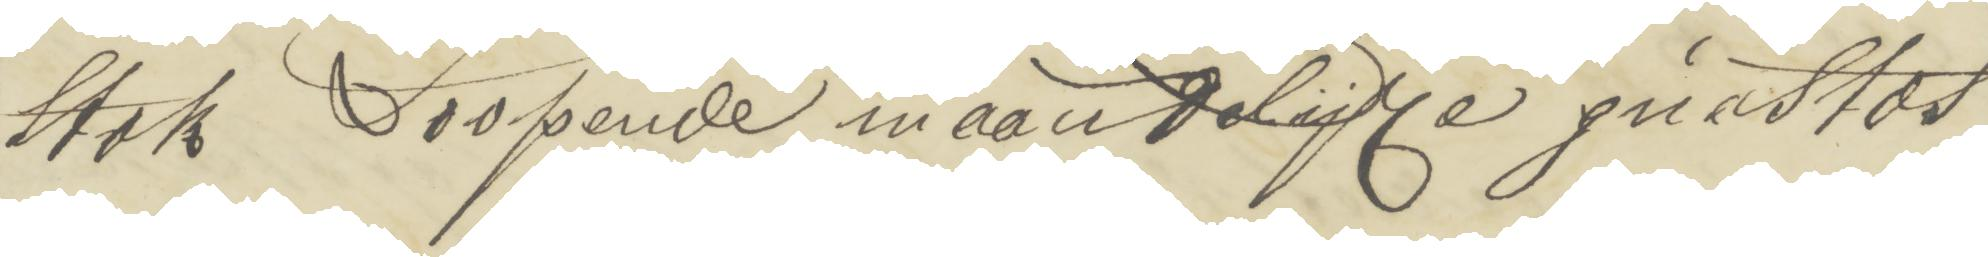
stok Loopende maandelijxe guastos
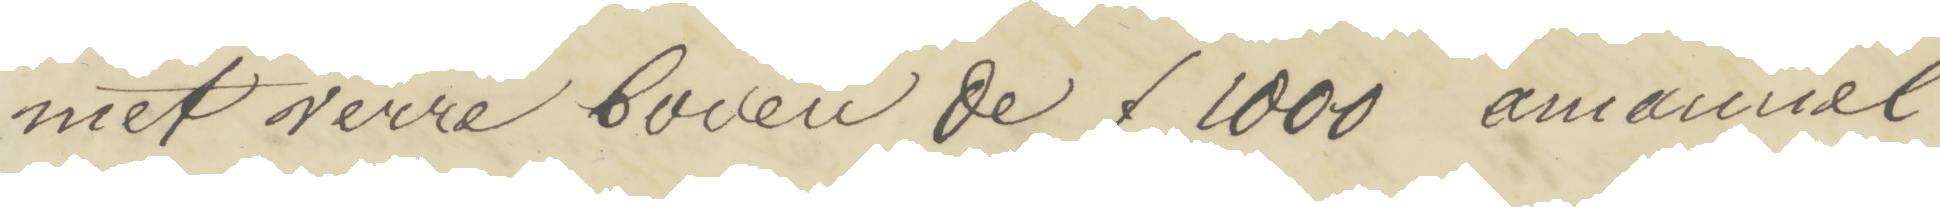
niet verre boden de ƒ 1000 amanuel
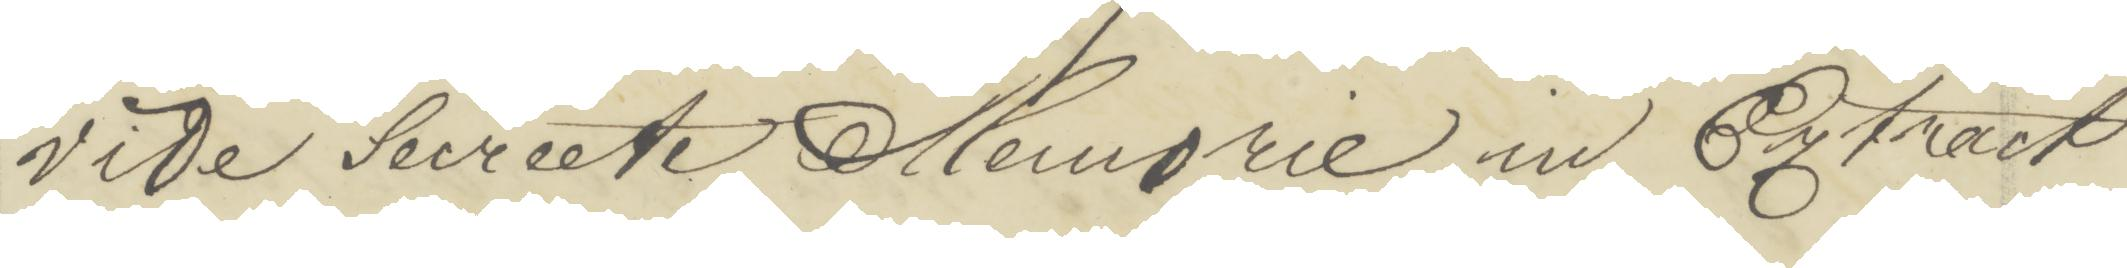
vide secreete Memorie in Extract
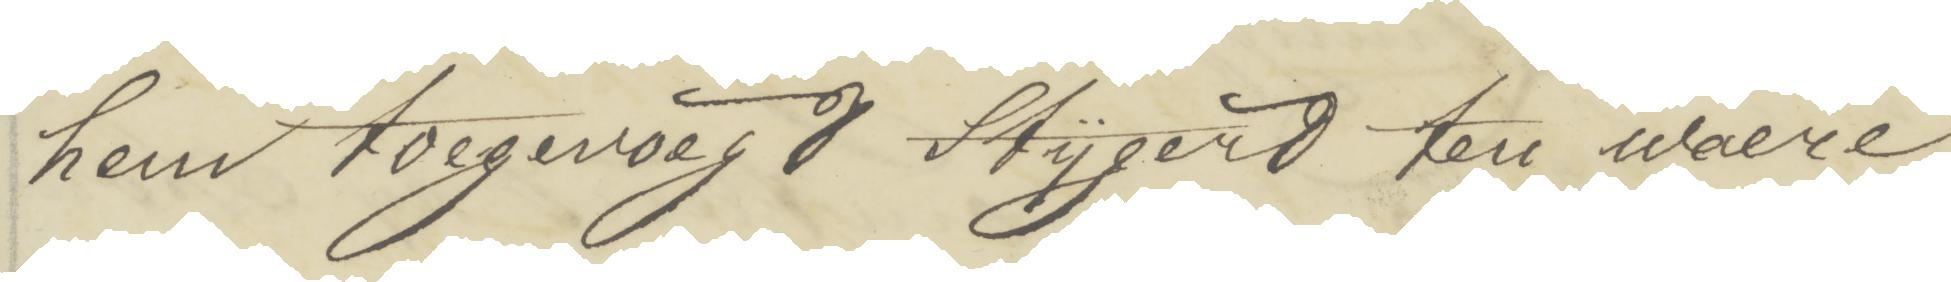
hem toegevoegd stijgerd ten waere
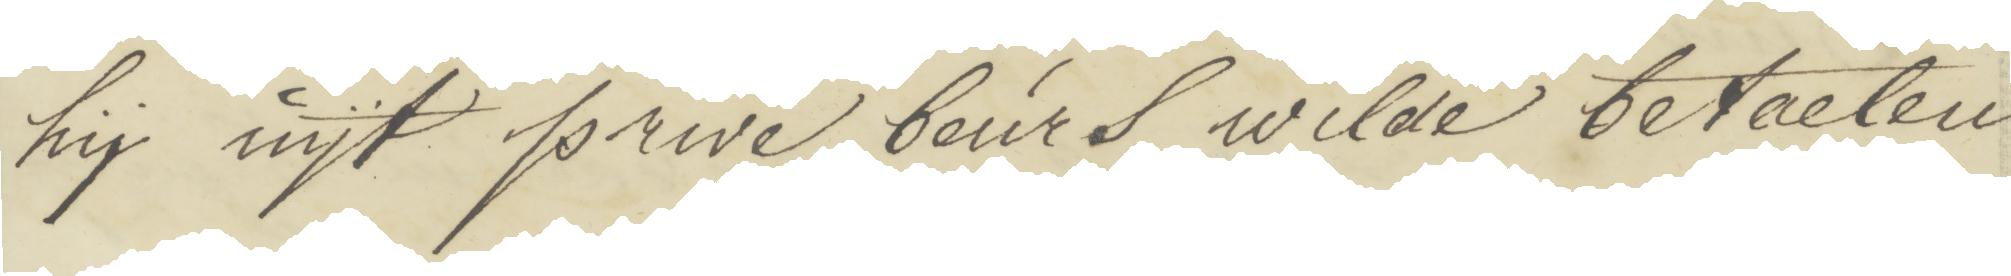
hij uijt prive beurs wilde betaelen
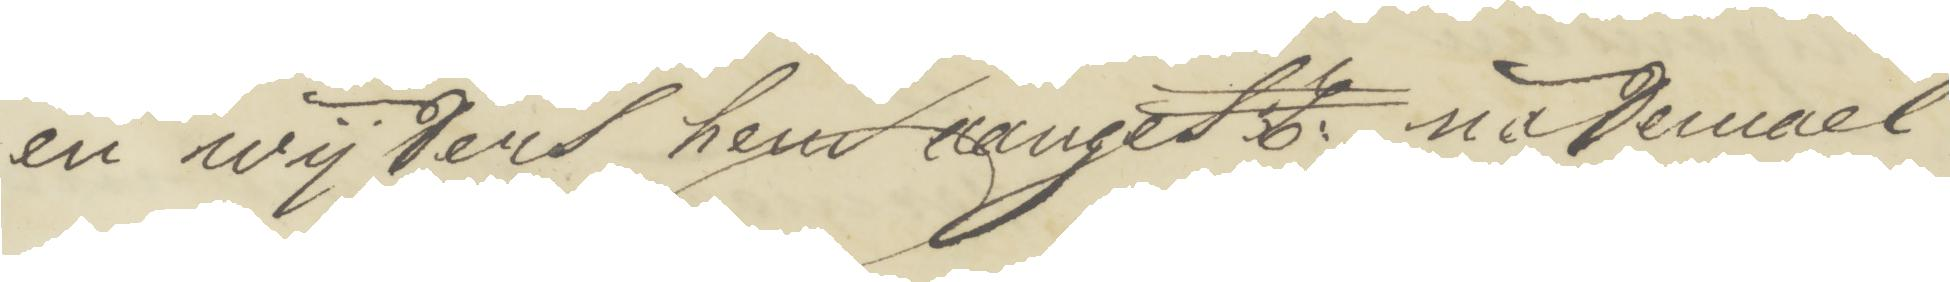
en wijders hem aangesz: nademael
